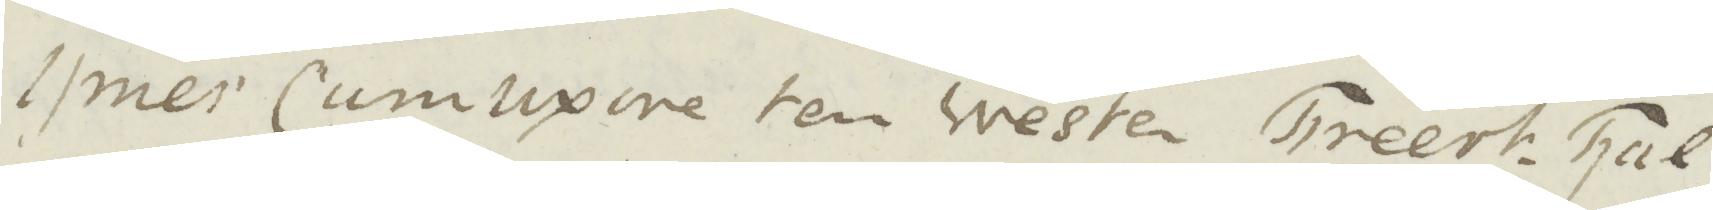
Ymer Cum uxore ten westen Freerk Tjal
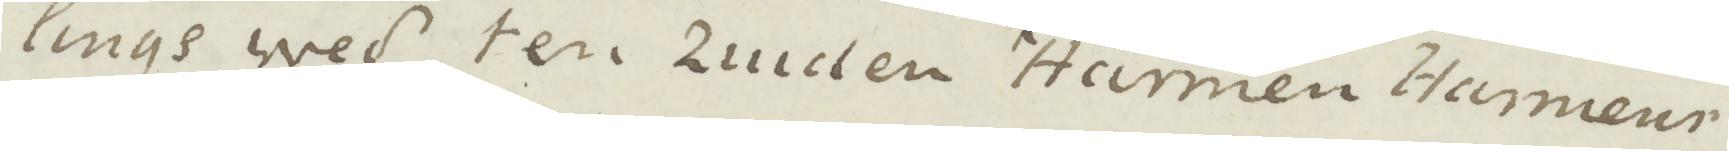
lings wed ten zuiden Harmen Harmens
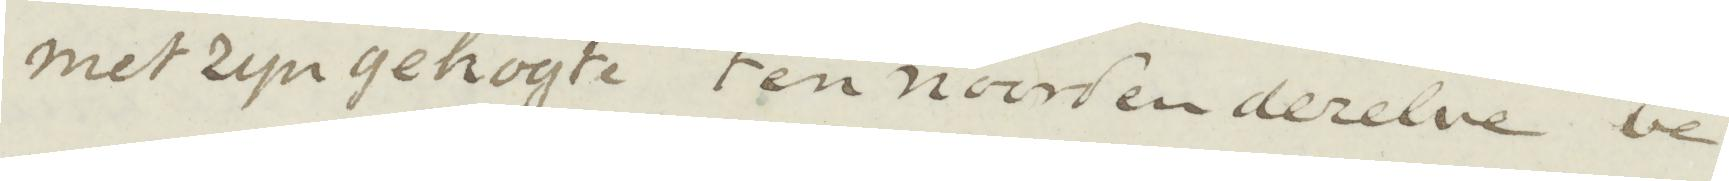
met zyn gekogte ten noorden dezelve be
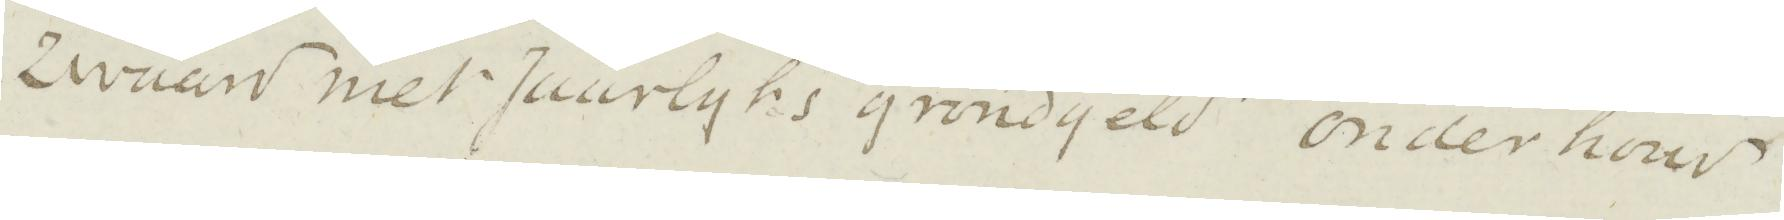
zwaard met Jaarlyks grondgeld onderhoud
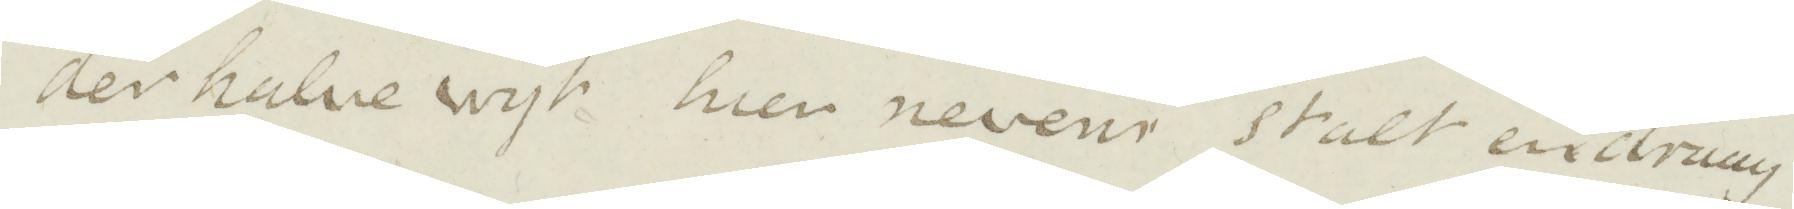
der halve wyt hier nevens stalt en draag
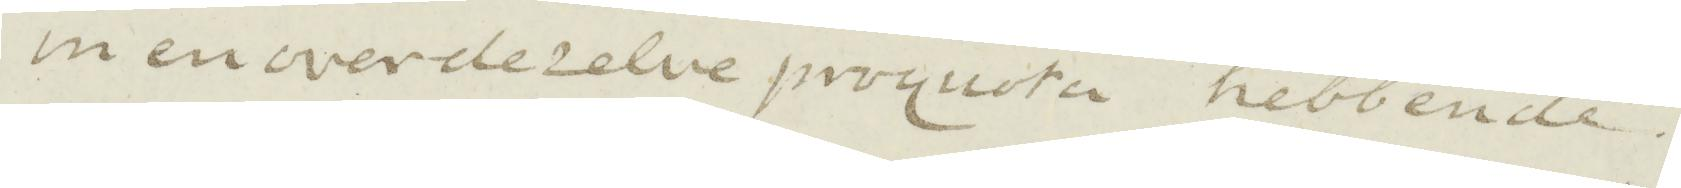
in en over dezelve proquota hebbende.
